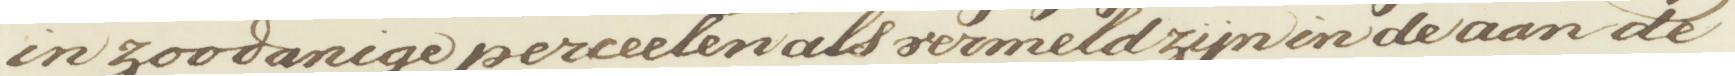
in zoodanige perceelen als vermeld zijn in de aan de
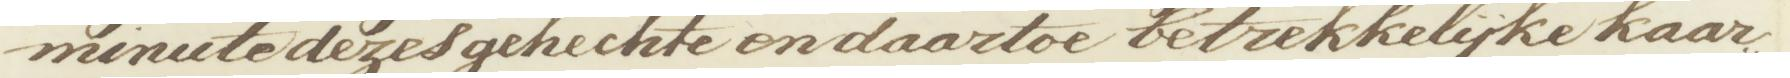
minute dezes gehechte en daartoe betrekkelijke kaar„
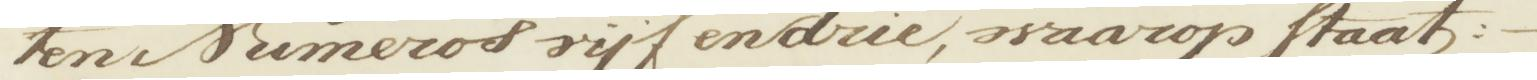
ten Numero's vijf en drie, waarop staat:
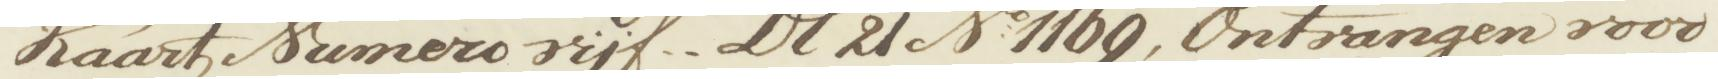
Kaart Numero vijf-- "Dl 21 N:o 1169, Ontvangen voor
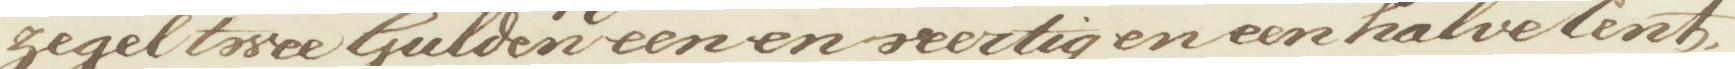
zegel twee Gulden een en veertig en een halve Cent,
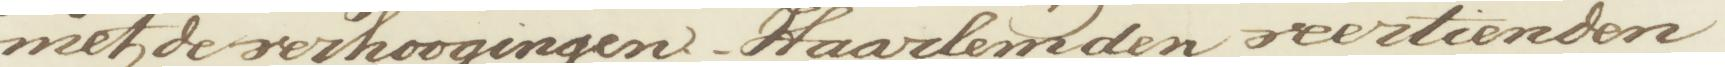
met de verhoogingen - Haarlem den veertienden
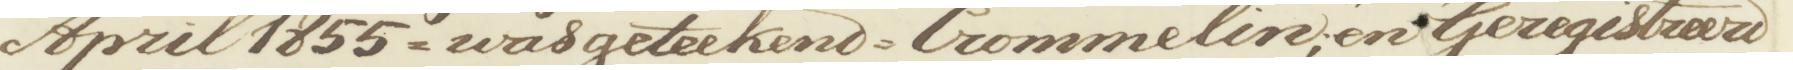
April 1855 = was geteekend = Crommelin," en "Geregistreerd
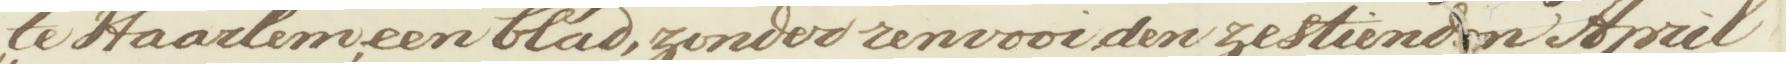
te Haarlem, een blad, zonder renvooi den zestienden April
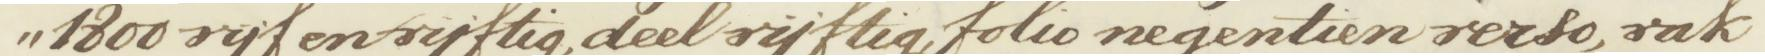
„1800 vijf en vijftig deel vijftig folio negentien verso vak
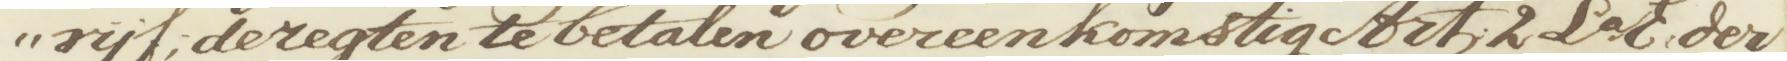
„ vijf deregten te betalen overeenkomstig Art: 2 L-a E: der
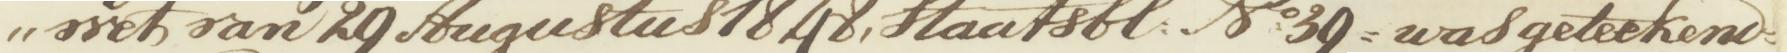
„ wet van 29 Augustus 1848. Staatsbl: N:o 39 = was geteekend =
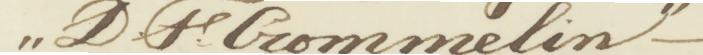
„ D.F: Crommelin"—
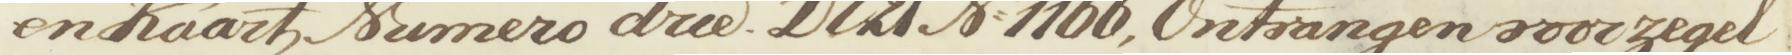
en Kaart Numero drie Dl 21 N=o 1166, Ontvangen voor zegel
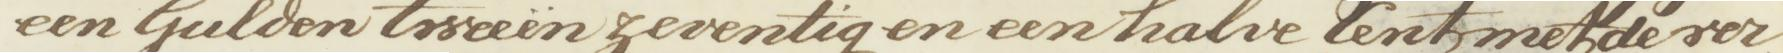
een Gulden tweeënzeventig en een halve Cent met de ver„
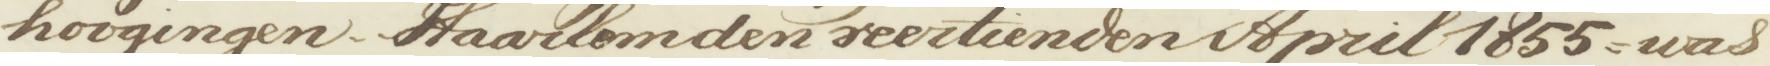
hoogingen- Haarlem den veertienden April 1855 = was
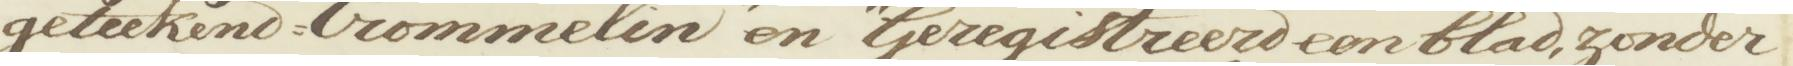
geteekend = Crommelin" en "Geregistreerd een blad, zonder
